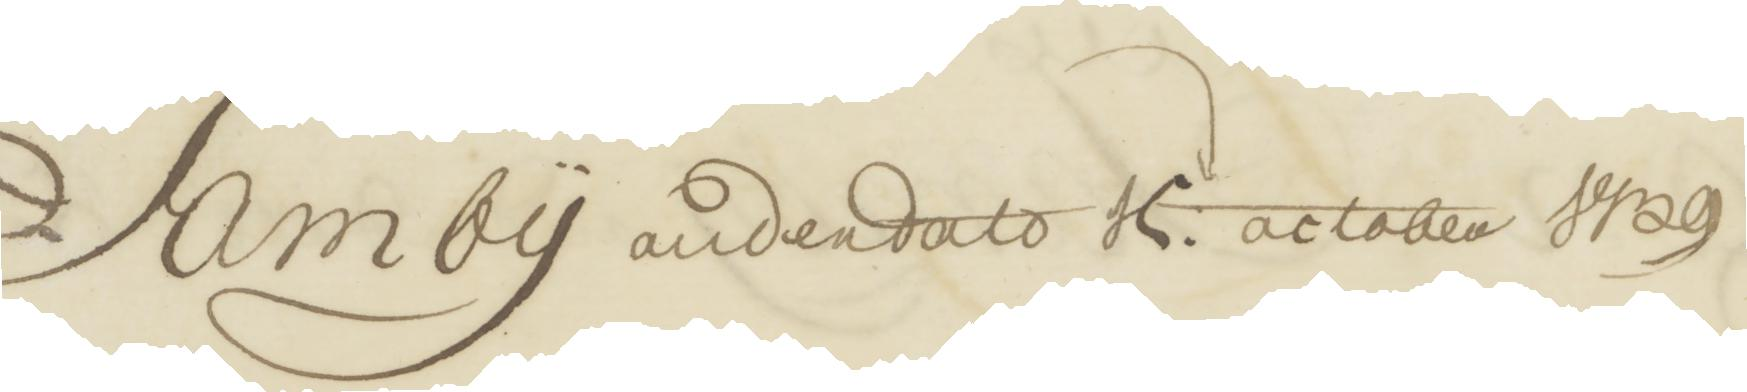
Van Jambij onder dato 15:' october 1739
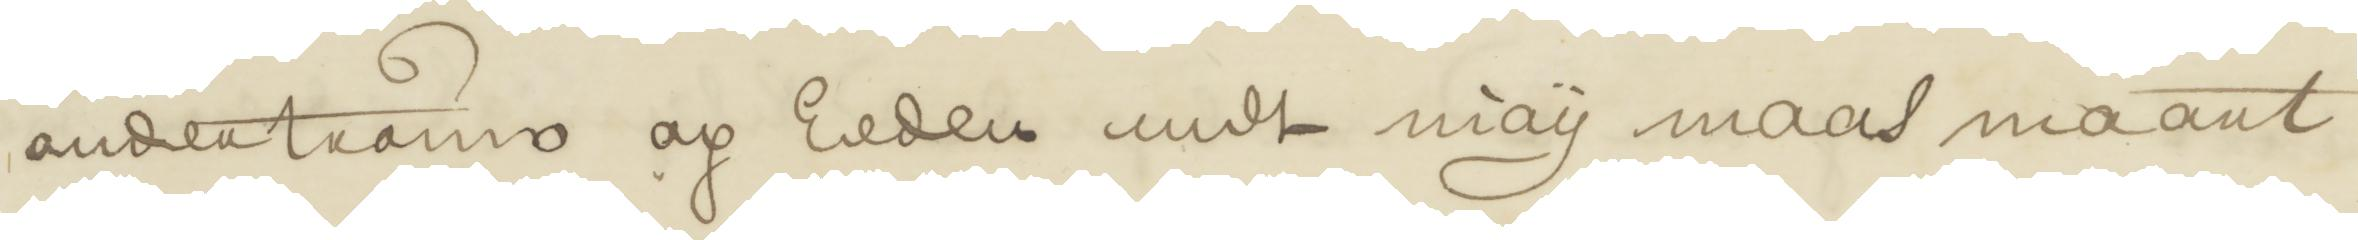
ondertrouw op heden met naij maas maart
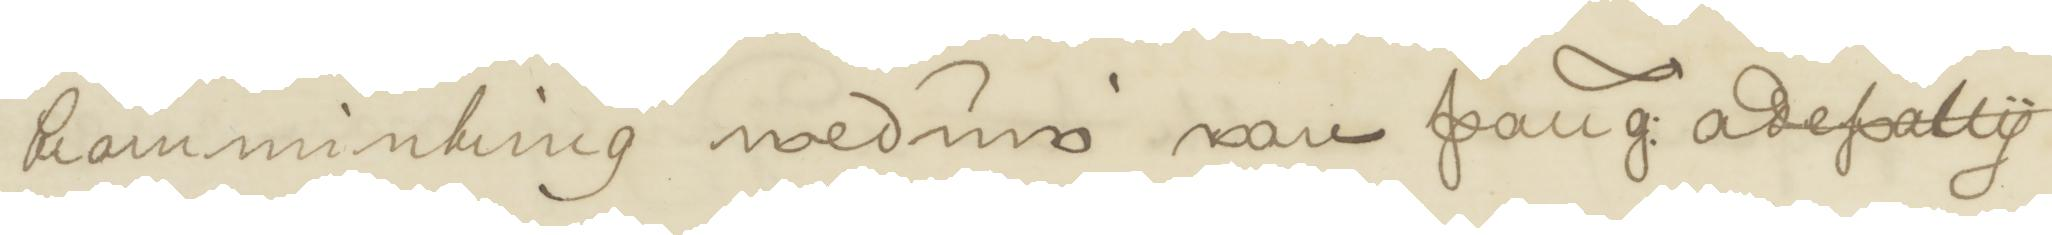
kamminking weduw van pang: adepattij
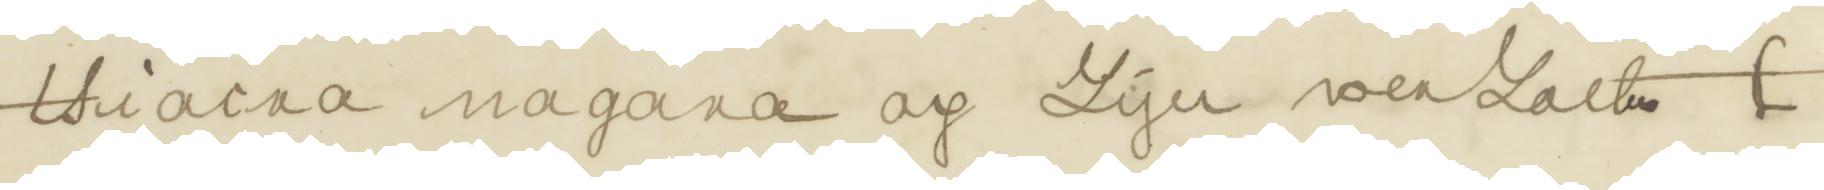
tsiacra nagara op zijn verzoek 't
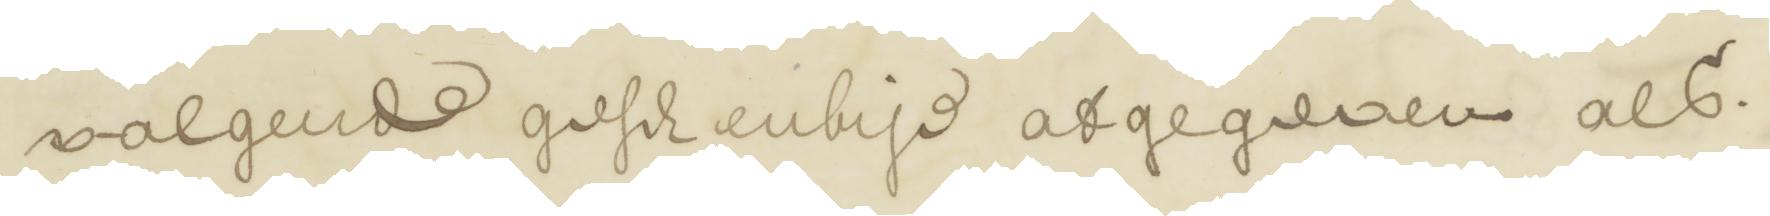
volgende geschenkje afgegeven als.
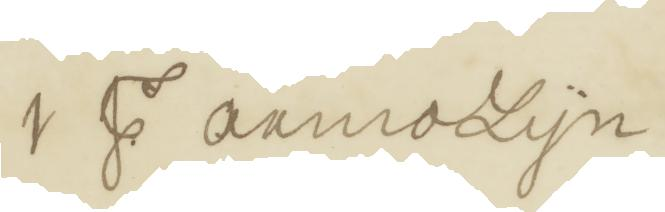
1 ps armozijn
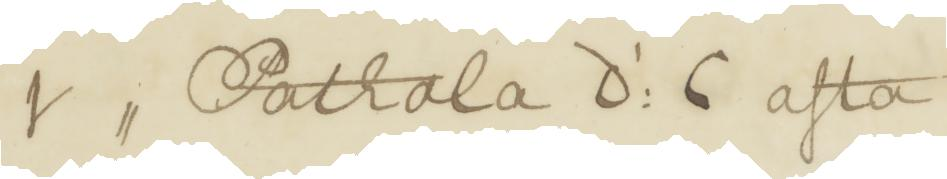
1 „ Pathala d:' 5 asta
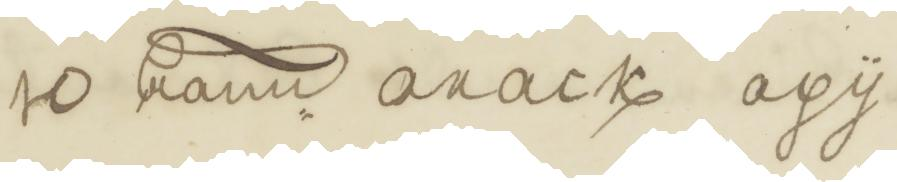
10 kann„ arack apij
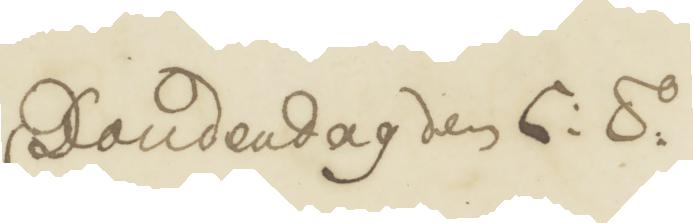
Donderdag den 5: d:o
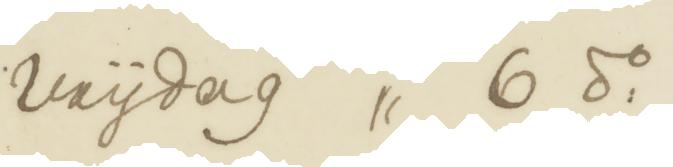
Vrijdag „ 6 d:o
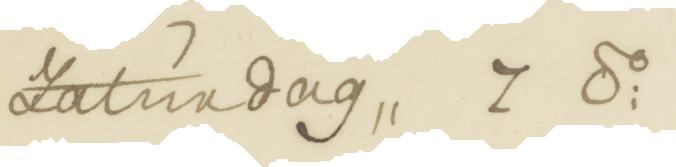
Zaturdag„ 7 d:o
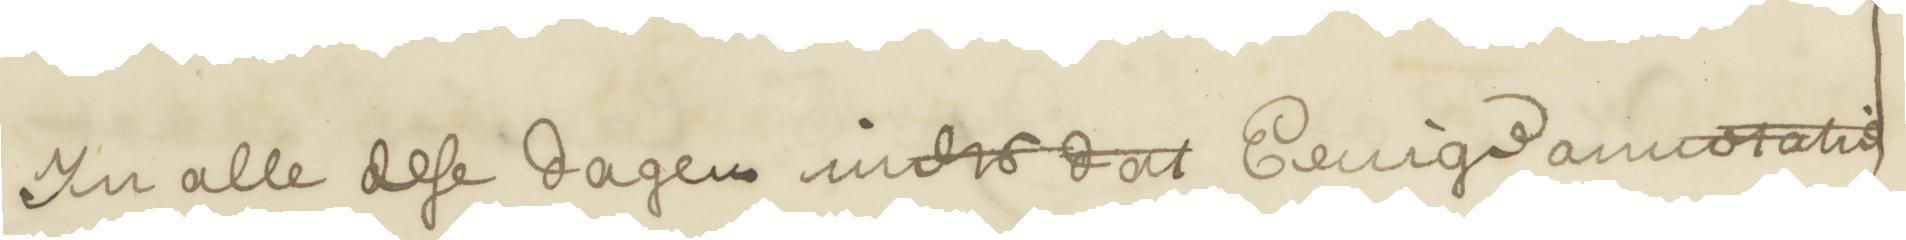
In alle dese dagen niets dat Eenige annotatie
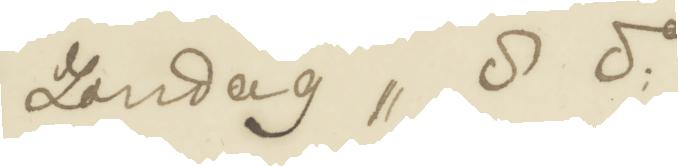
Zondag „ 8 d:o
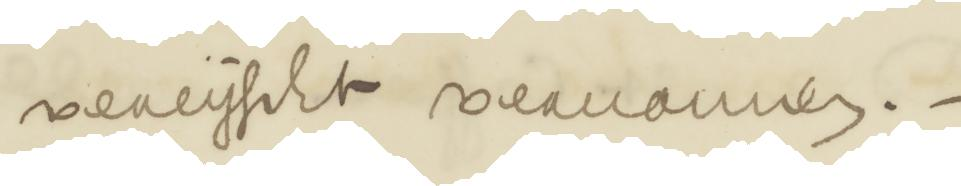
vereijscht vernomen.
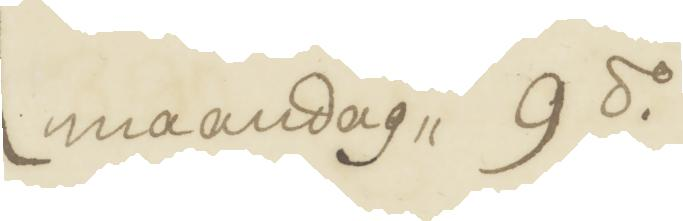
maandag„ 9 d.o
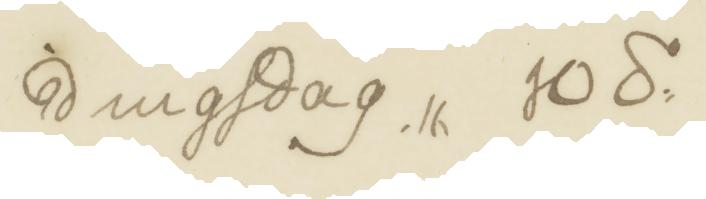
dingsdag .„, 10 d:o
